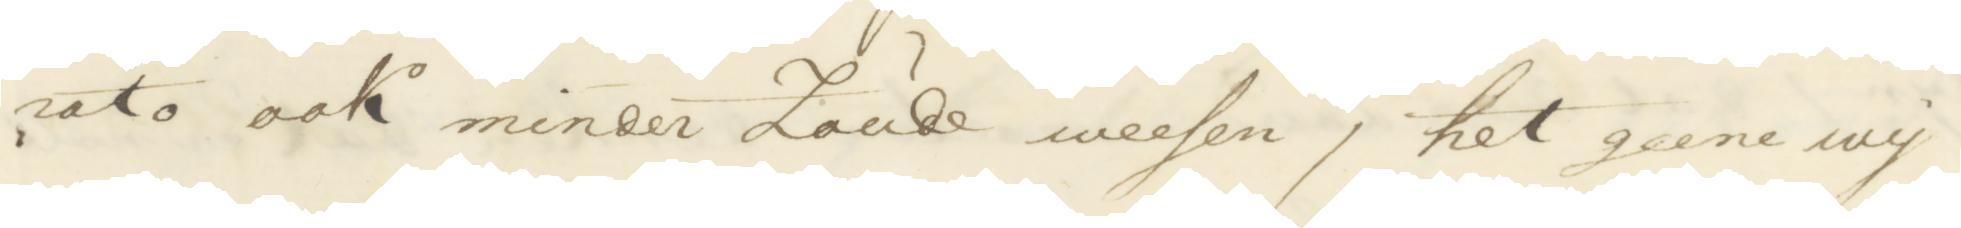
rato ook minder zoude weesen, het geene wij
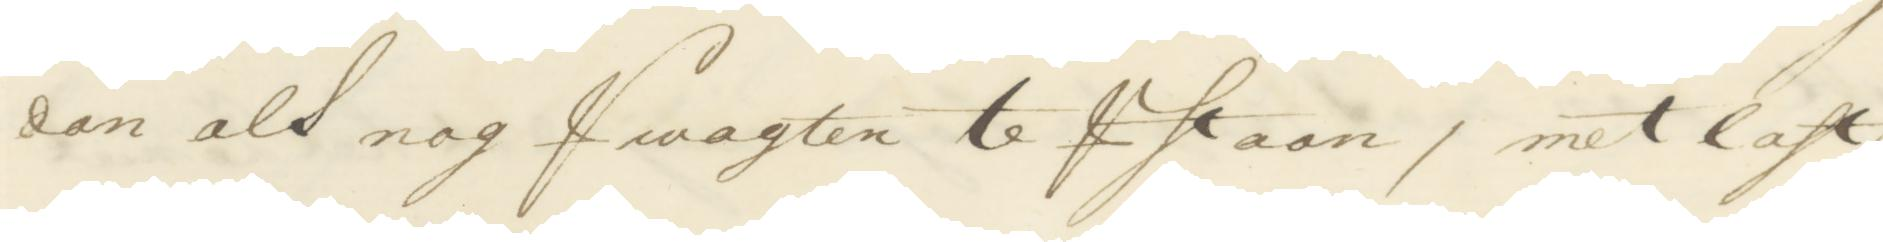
dan als nog verwagten te verstaan, met last
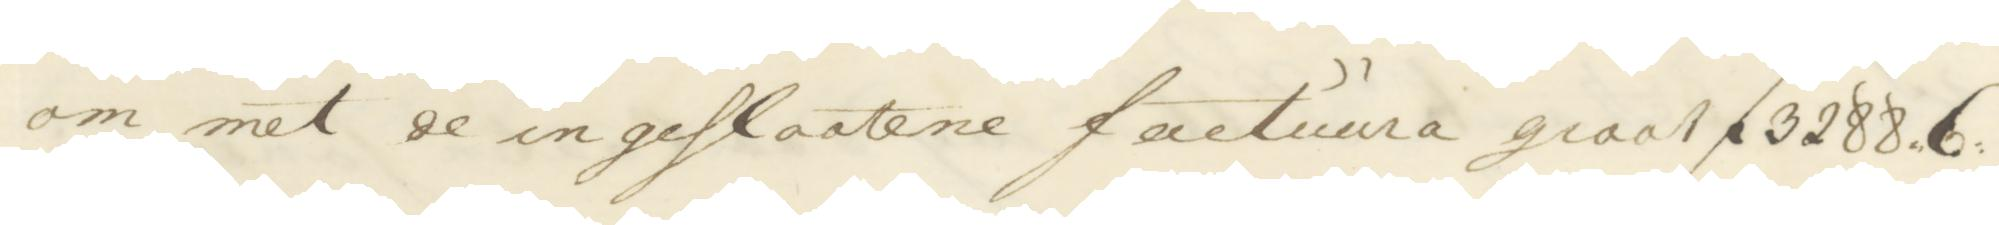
om met de ingeslootene factuura groot ƒ3288„6:
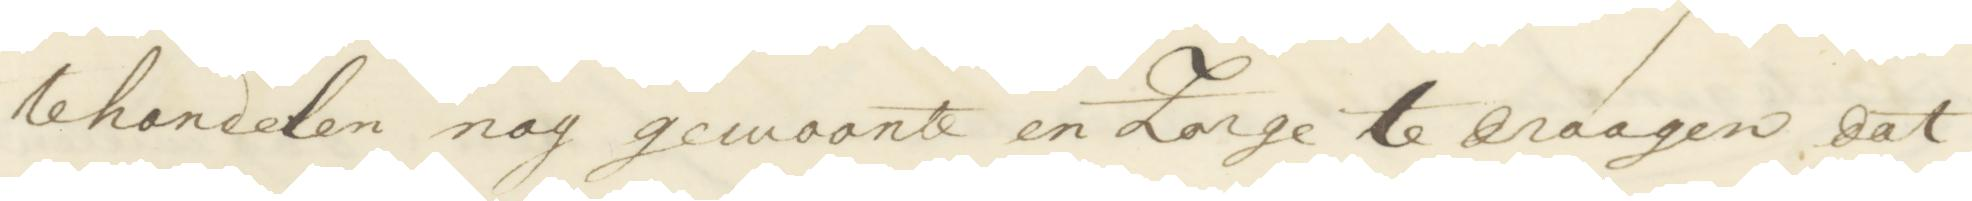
te handelen nog gewoonte en zorge te draagen dat
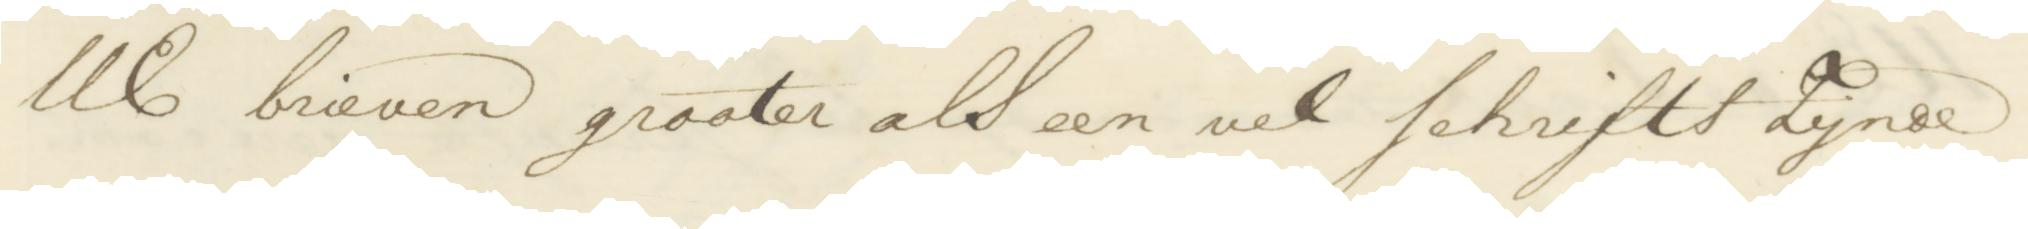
UE brieven grooter als een vel schrifts zijnde
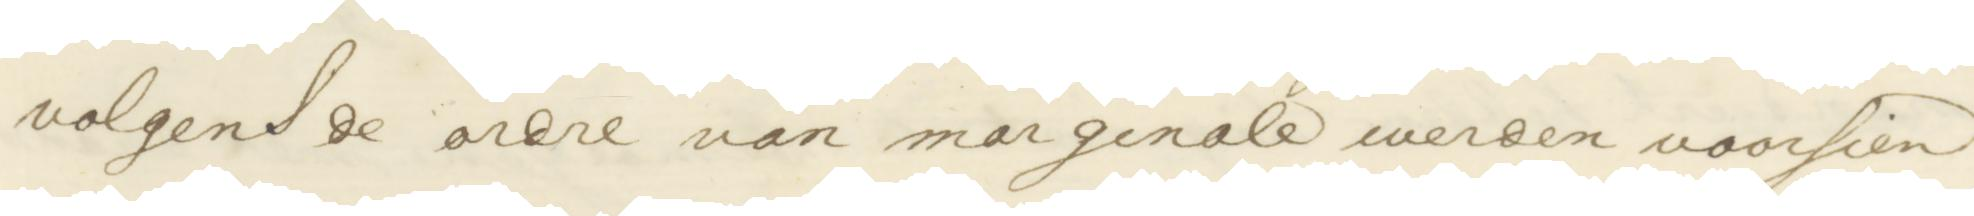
volgens de ordre van marginale werden voorsien
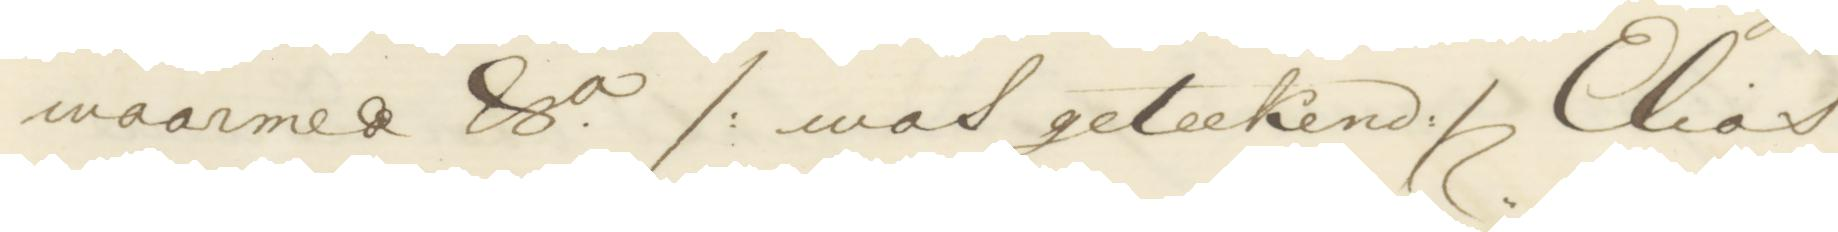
waarmede &.a /:was geteekend:/ Elias
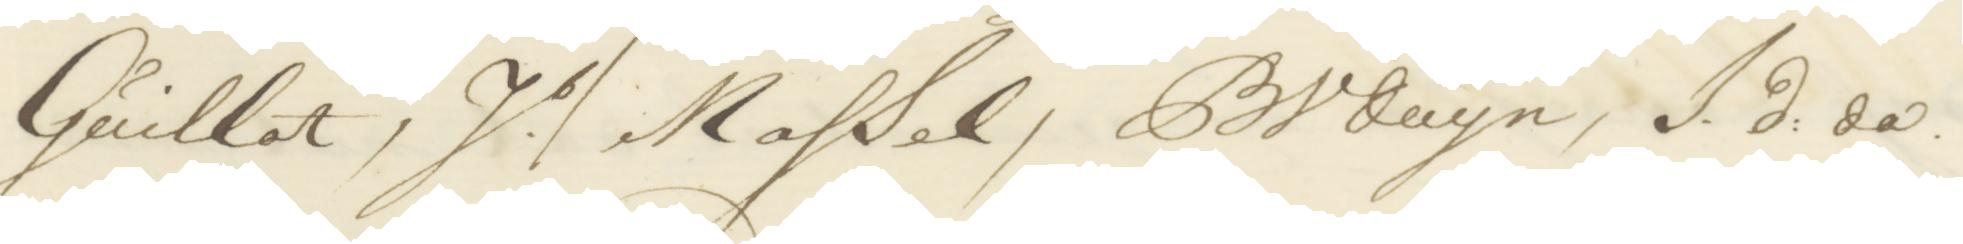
Guillot, J:s Mossel, BVduijn, I: d: da„
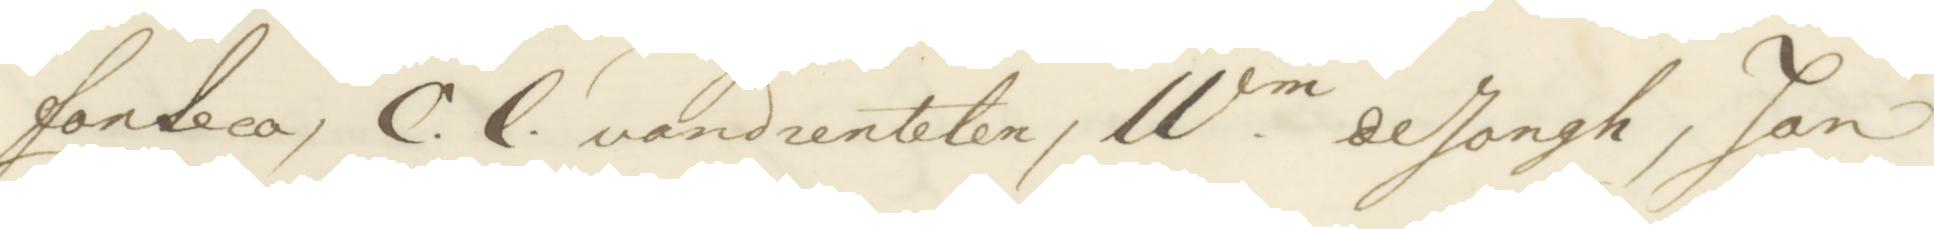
fonseca, C: C: vandrentelen, W.m de Jongh, Jan
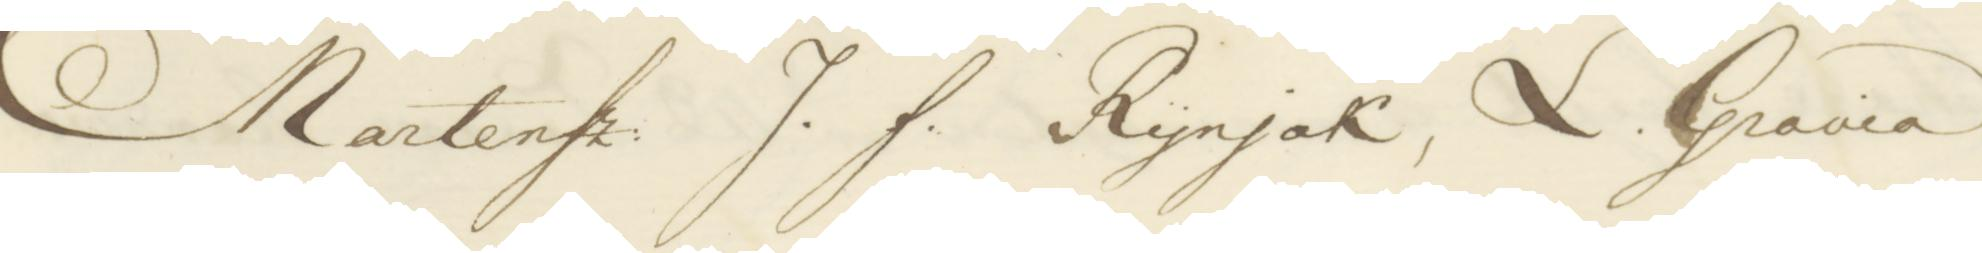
Martensz: J: f: Rijnjak, L. Gravia
